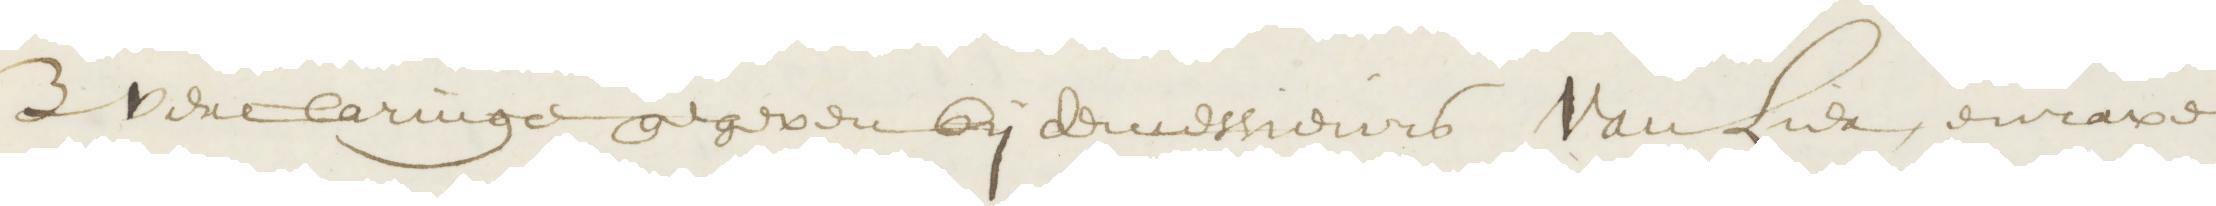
3 verclaringe gegeven bij den messieurs Van Lier, en rave
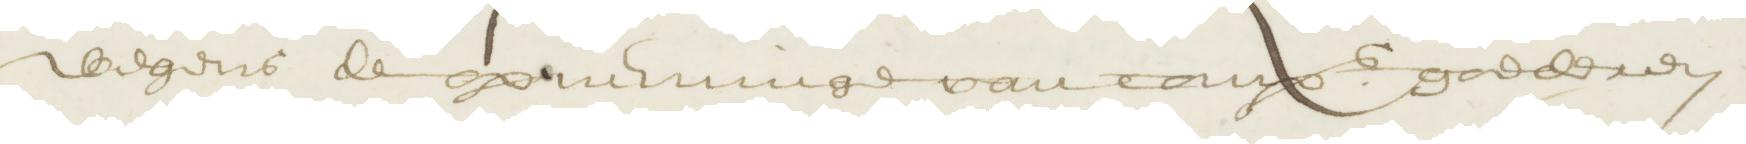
wegens de opneminge van comp:s goederen
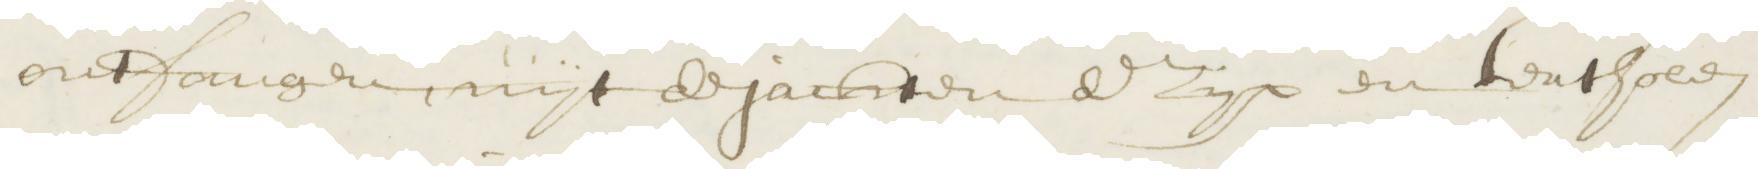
ontfangen, uijt de jachten de Zijp en Tertholen
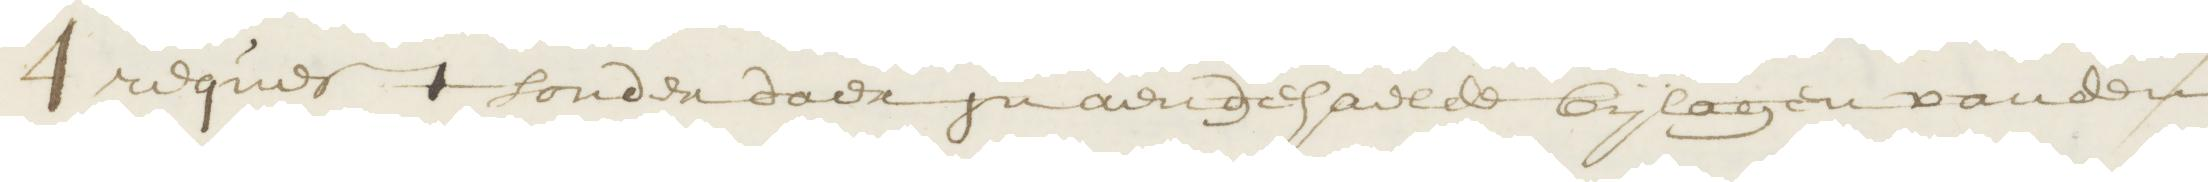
4 request sonder daer jn aengehaelde bijlagen vanden
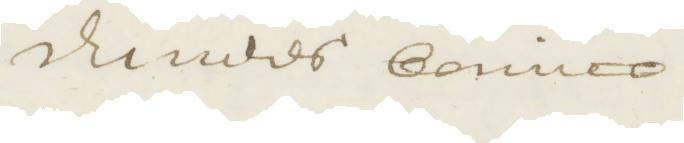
chinees coninck
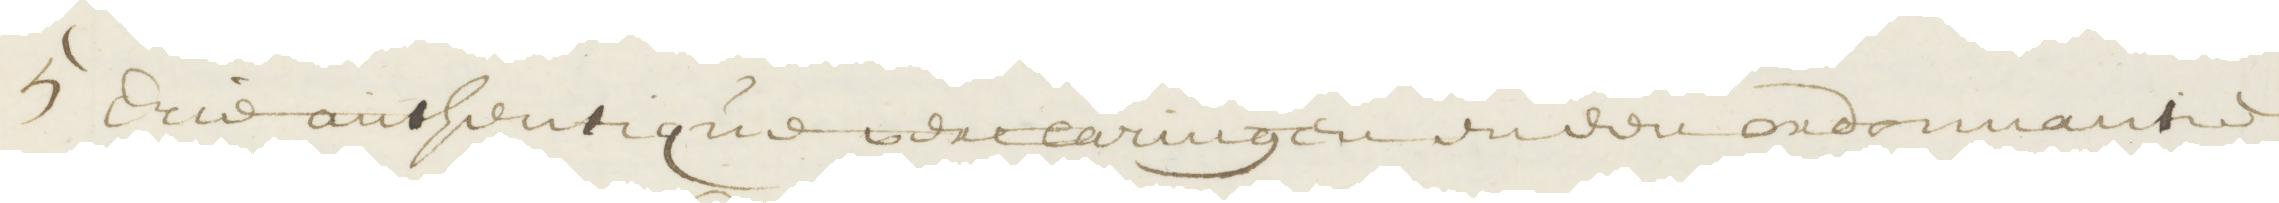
5 drie authentique verclaringen en een ordonnantie
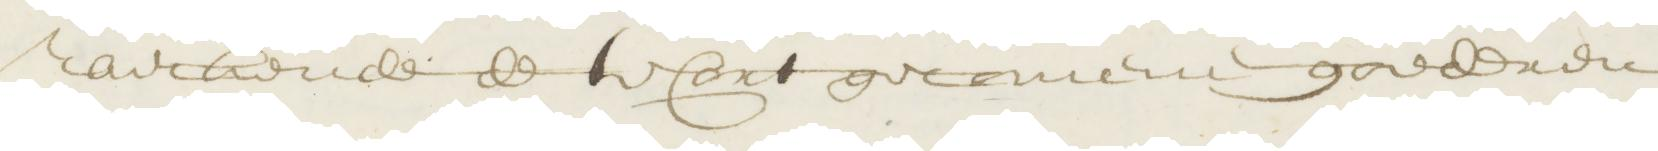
raeckende de te Cort gecomene goederen
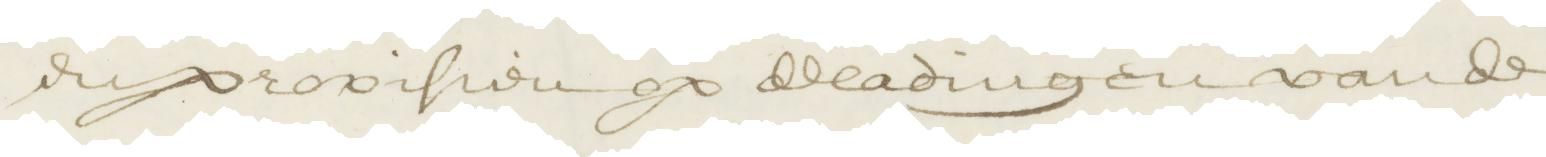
en provisien op de ladingen vande
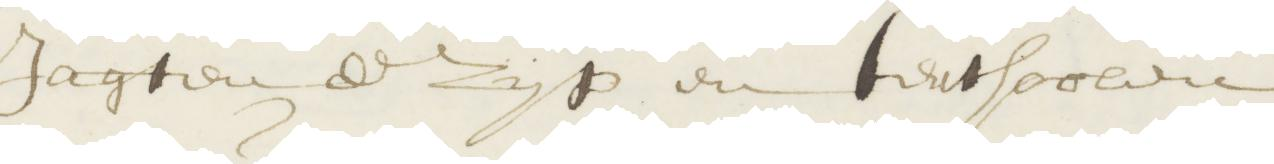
Jagten de Zijp en Terthoolen
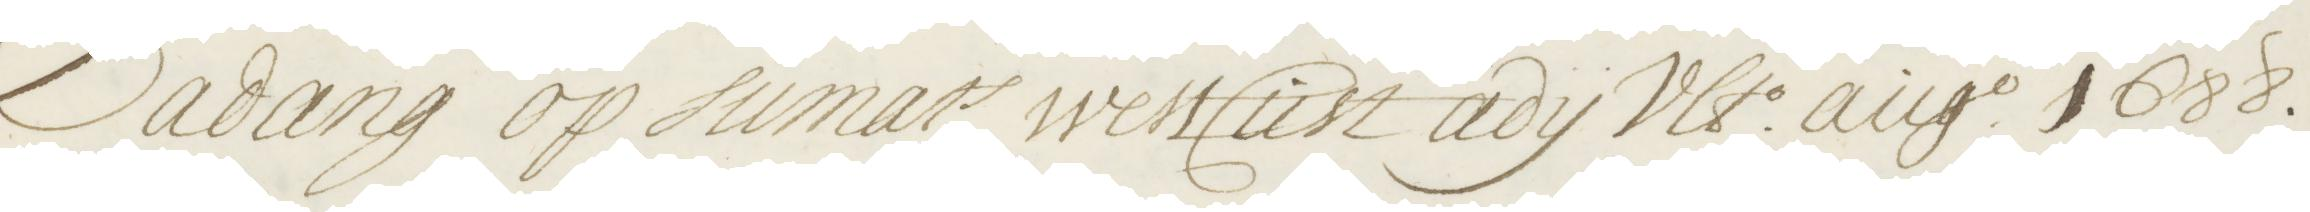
Padang op Sumat.s westCust adij Vlt.o aug.o 1688.
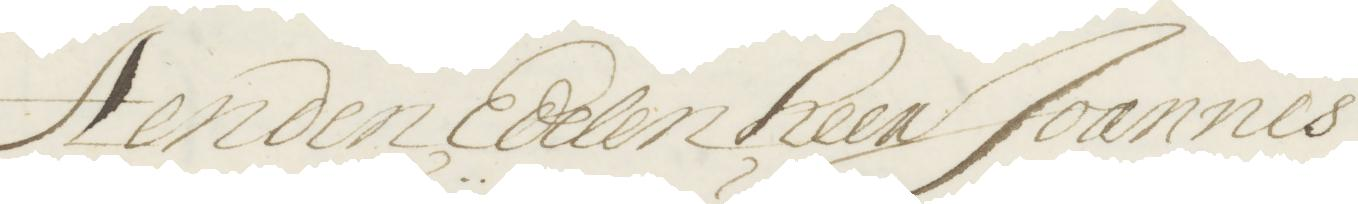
Aenden Edelen heer Joannes
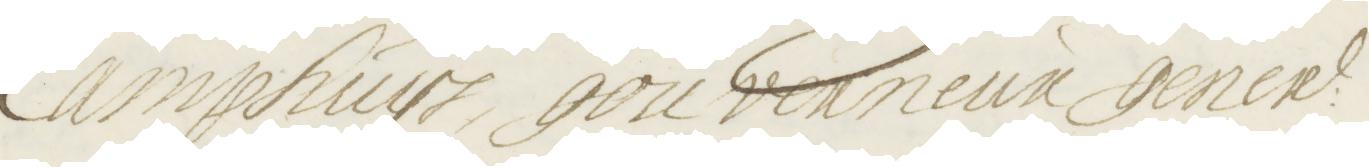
Camphuijs, gouverneur gener:l
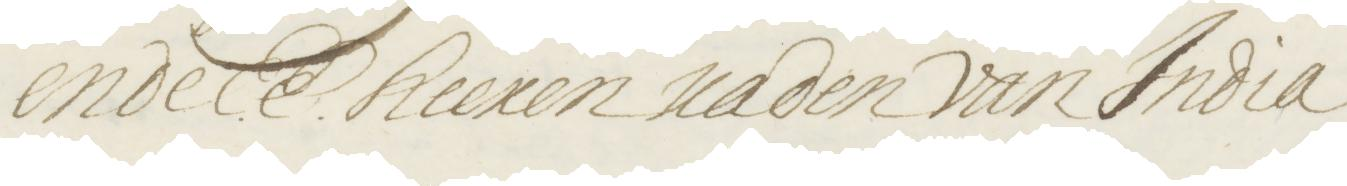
ende Ed. heeren raden van India
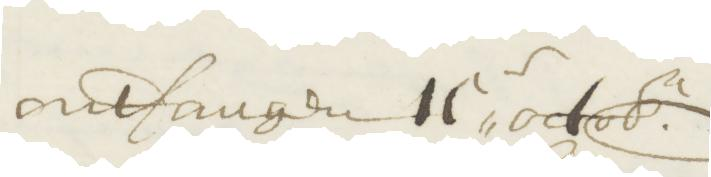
ontfangen 15„en octb.r
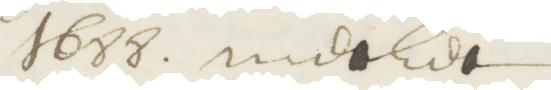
1688. met het
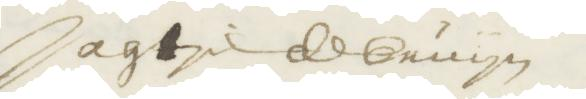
jagtje de bruijn
